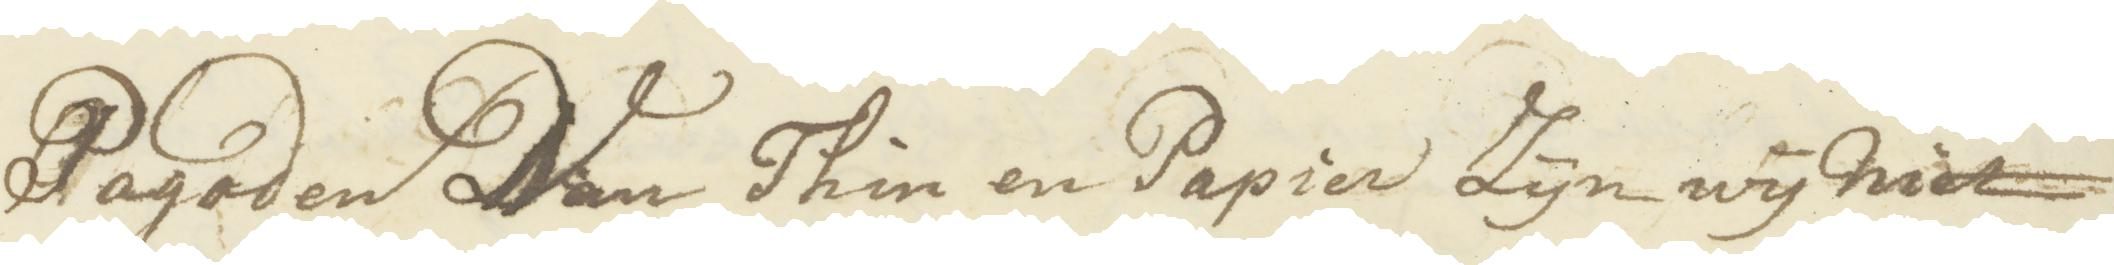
Pagoden Van Thin en Papier zijn wij niet
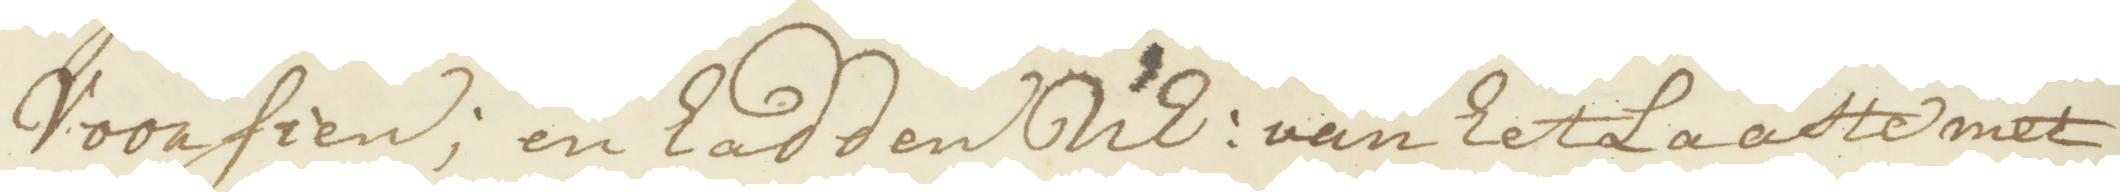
voorsien; en hadden uE: van het laaste met
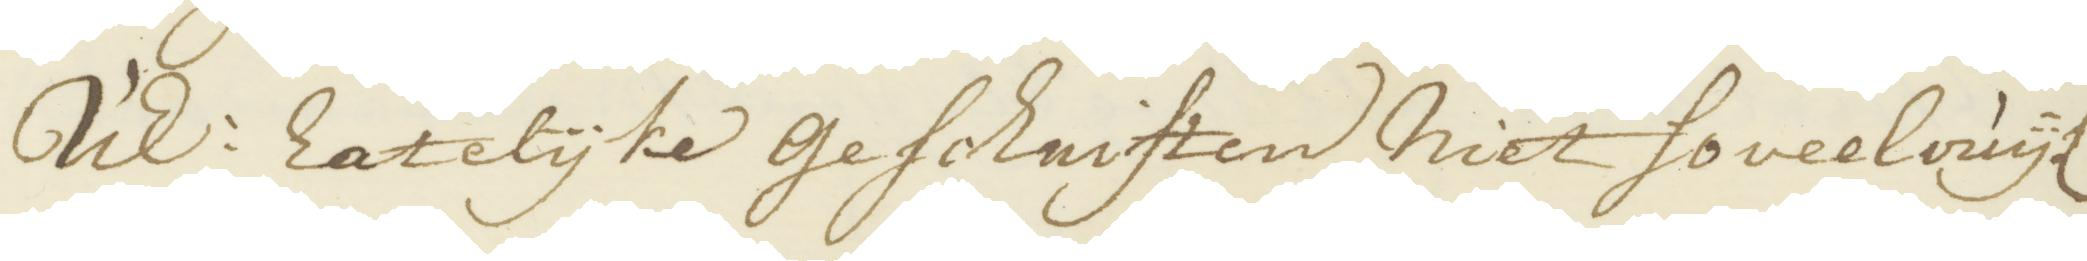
UE: hatelijke geschriften niet soveelvuijl
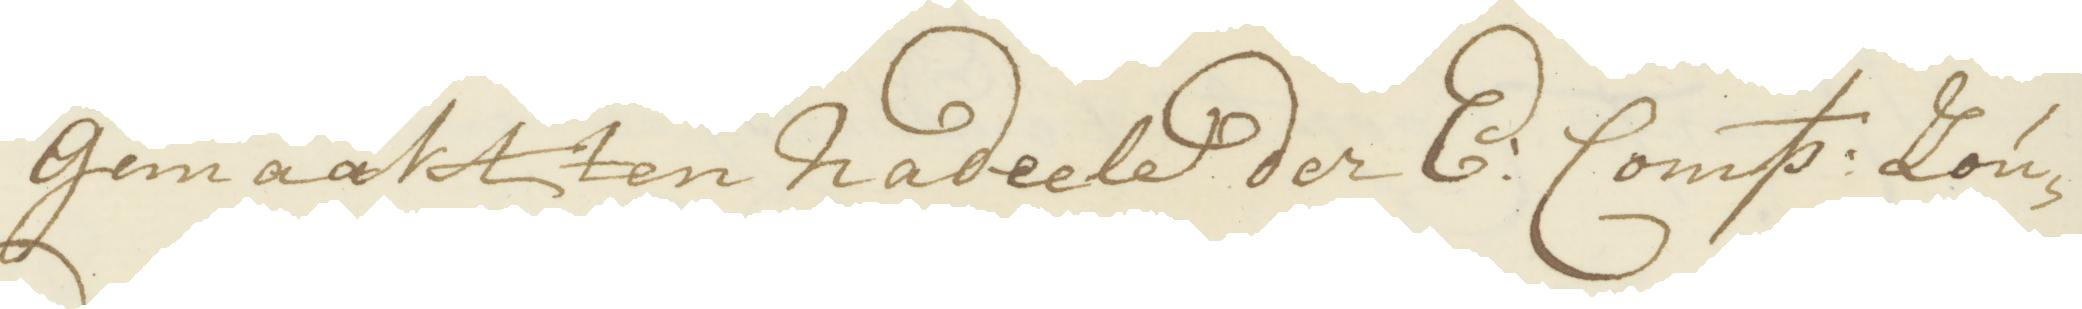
gemaakt ten nadeele der E: Comp: zou
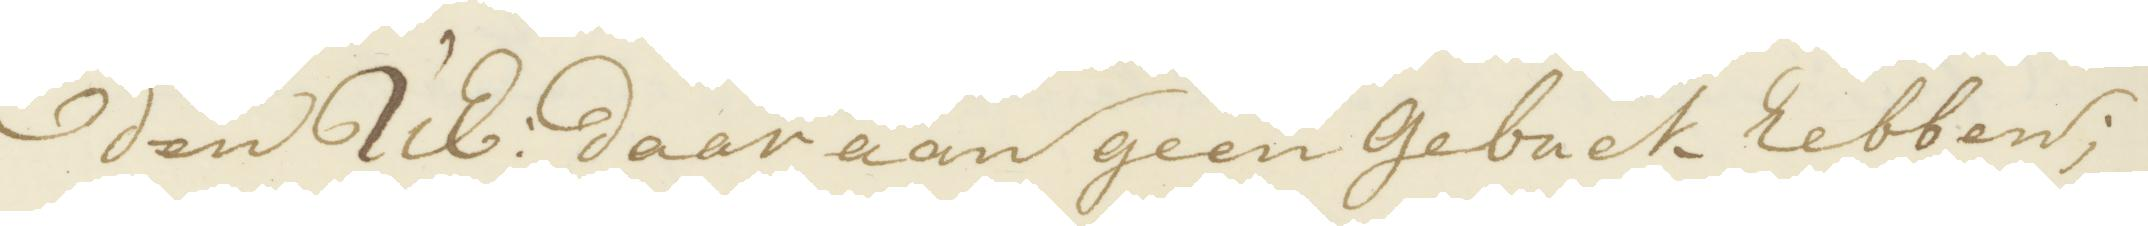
den UE: daar aan geen gebrek hebben;
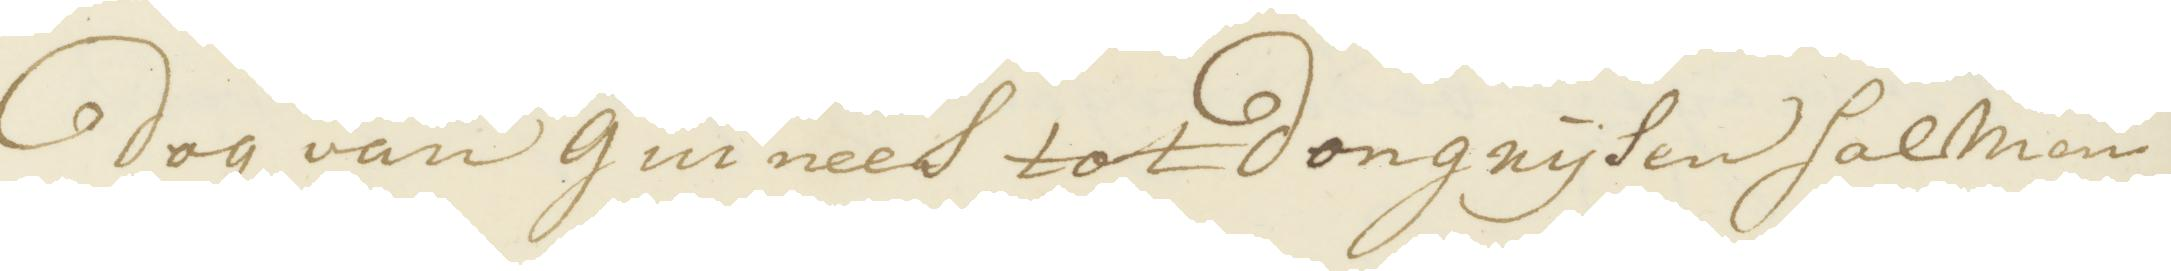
dog van guinees tot dongrijsen salmen
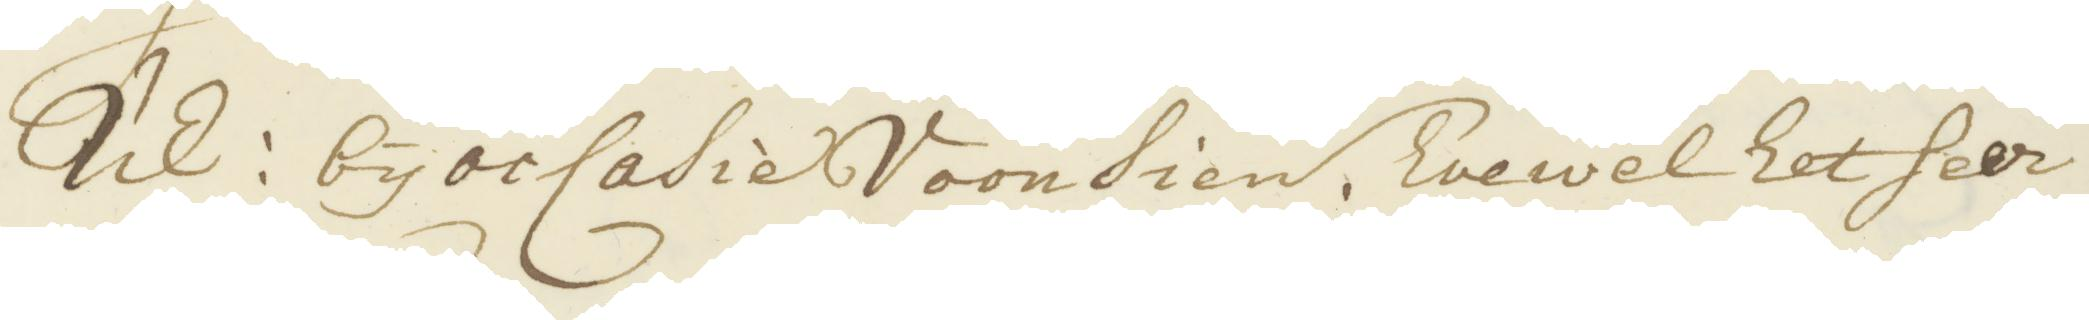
UE: bij occasie voorsien, hoewel het seer
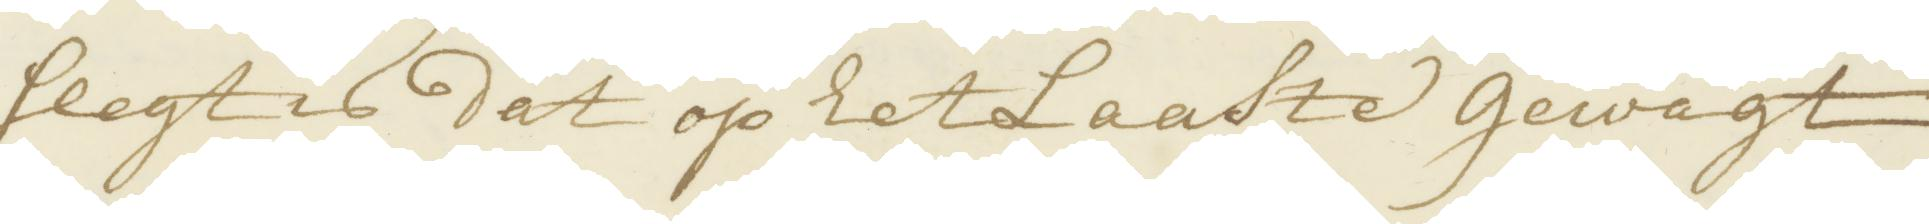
slegt is dat op het Laaste gewagt
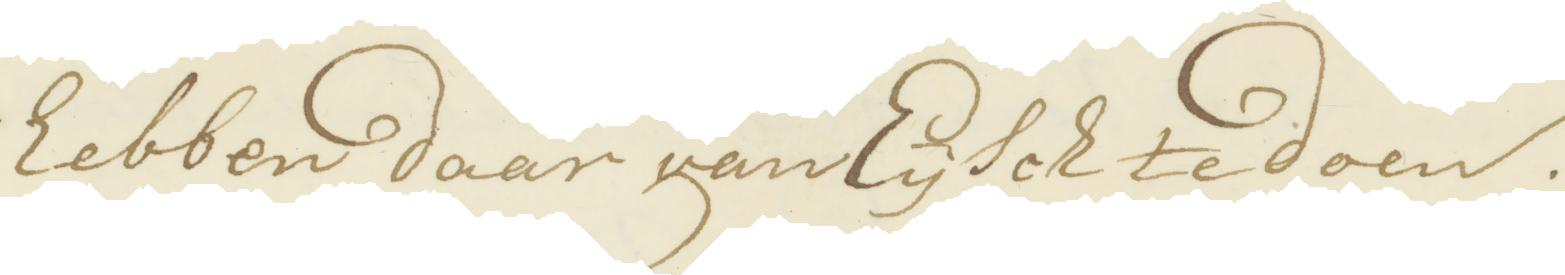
hebben daar van Eijsch te doen.
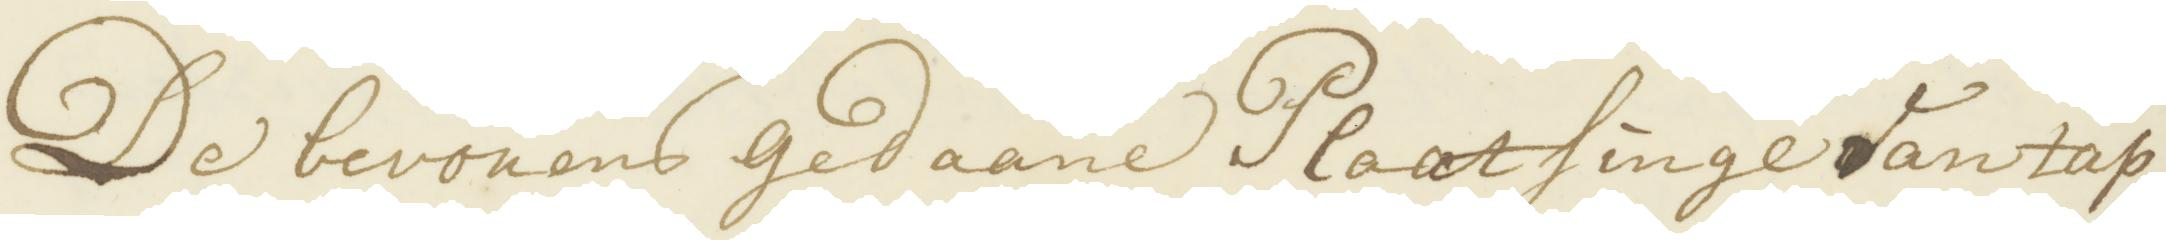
De bevorens gedaane Plaatsinge van tap
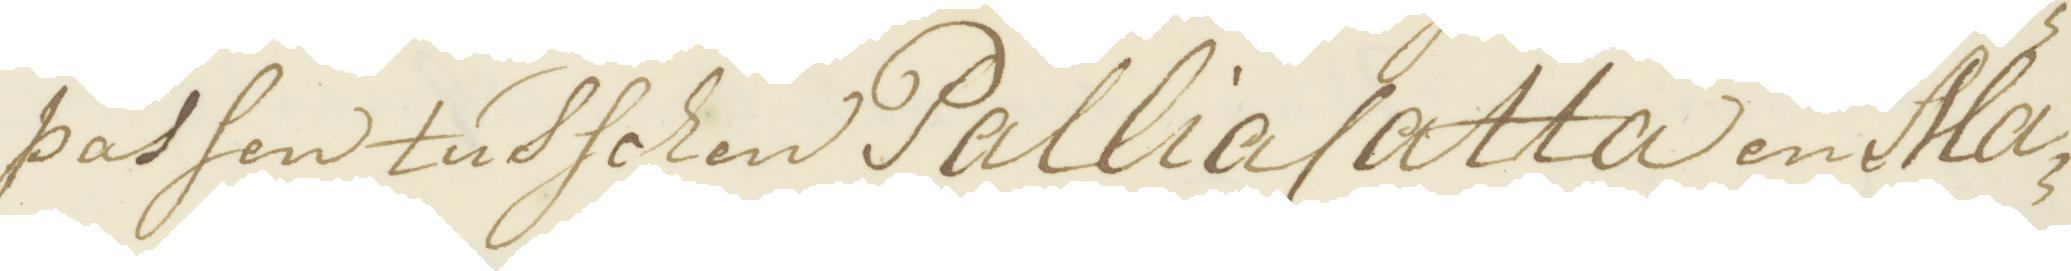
passen tusschen Palliacatta en Ma„
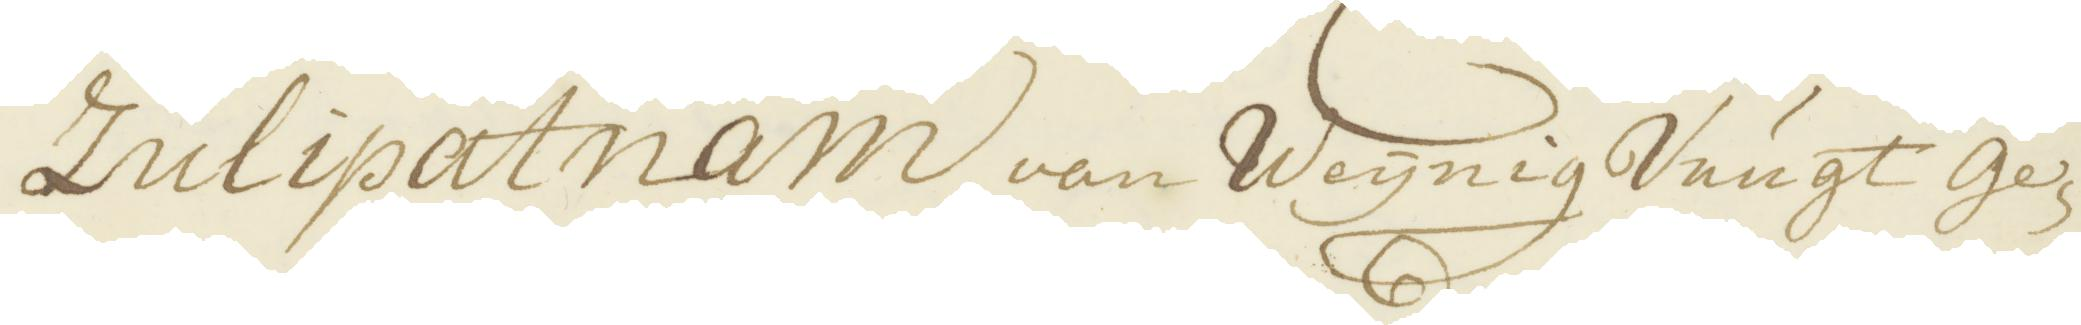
zulipatnam van weijnig vrugt ge
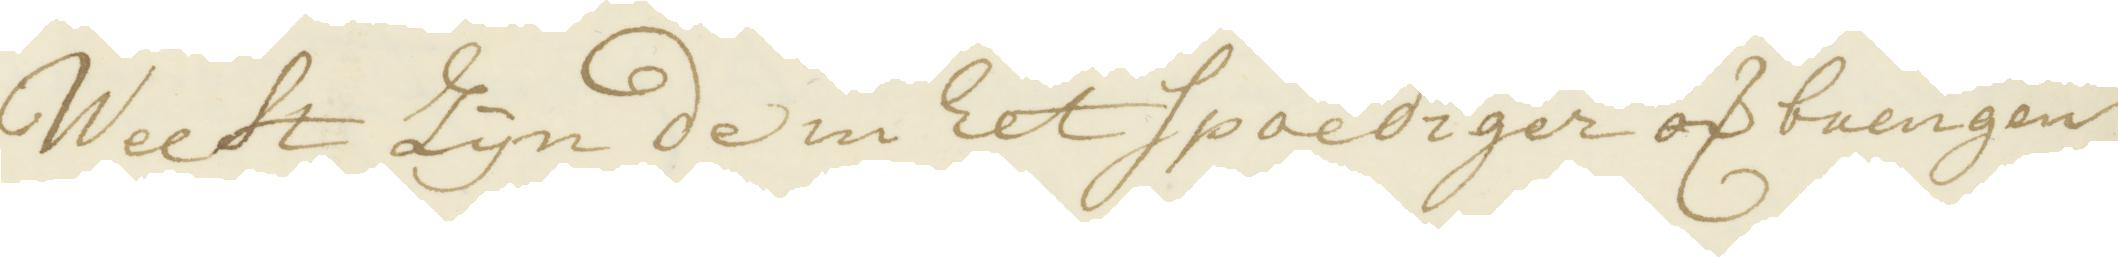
weest zijn de in het spoediger overbrengen
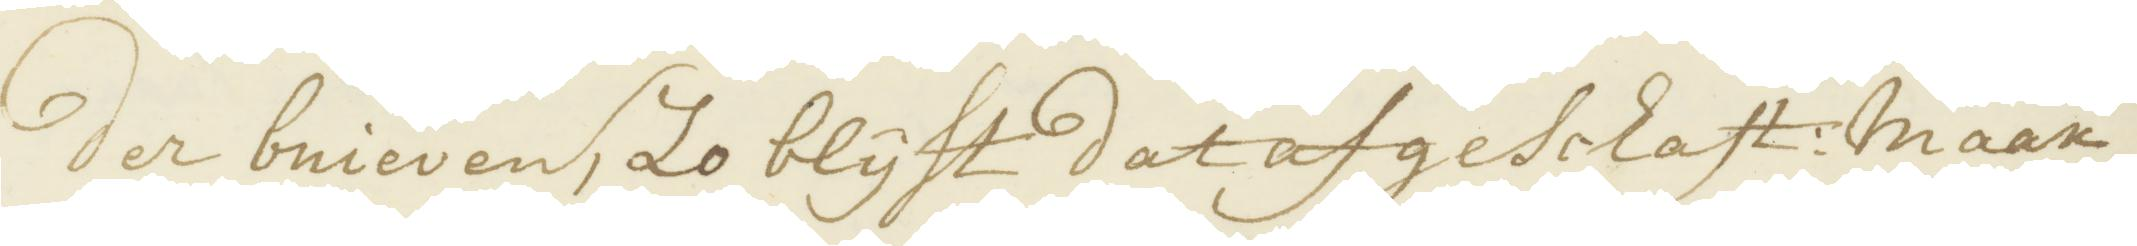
der brieven, zo blijft dat afgeschaft: maar
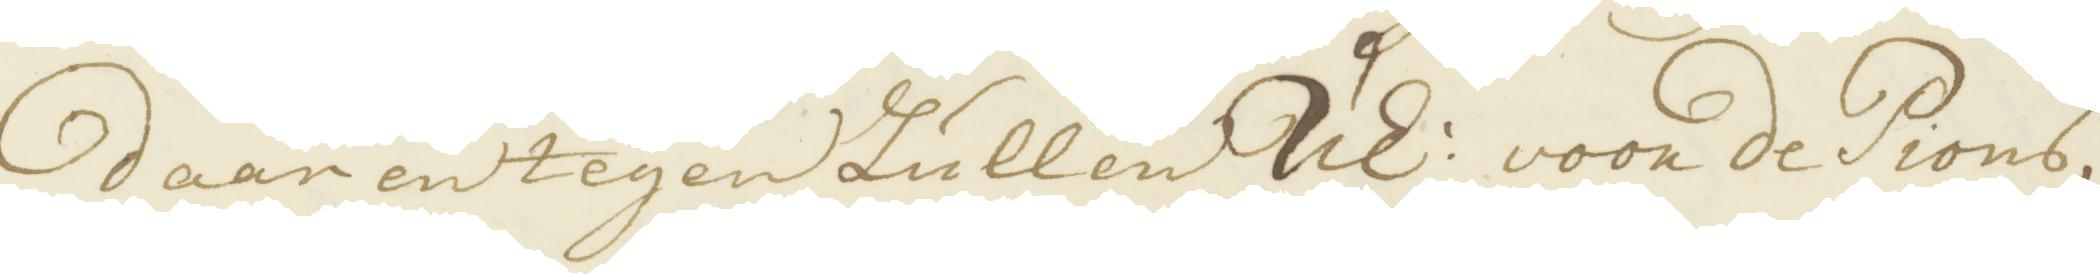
daar en tegen zullen UE: voor de Pions,
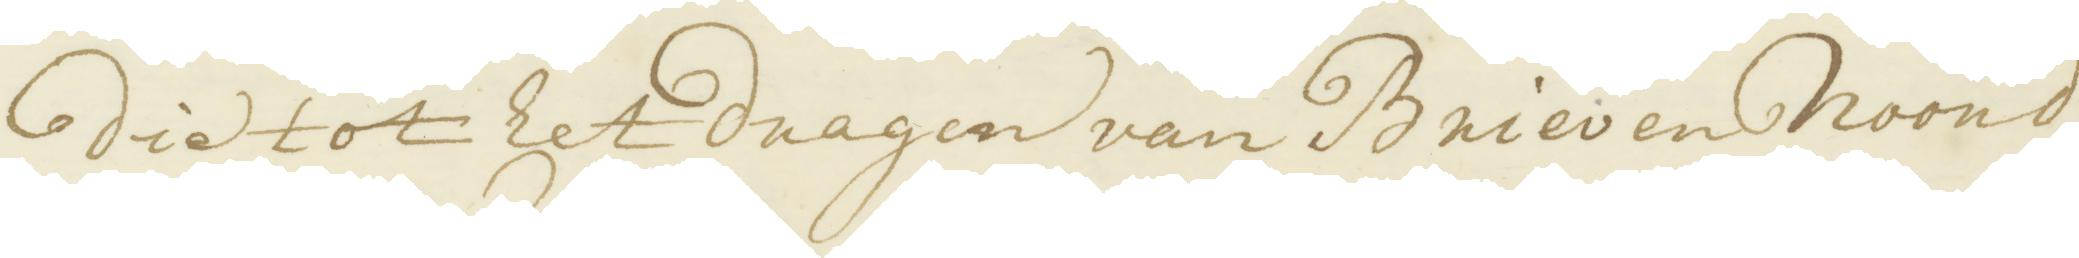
die tot het dragen van Brieven noord
